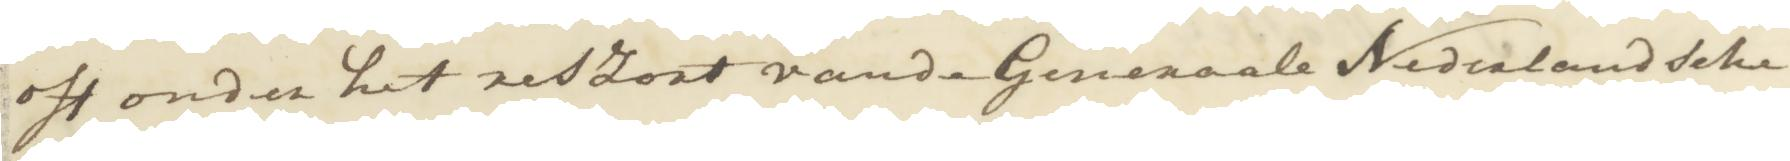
off onder het reszort van de Generaale Nederlandsche
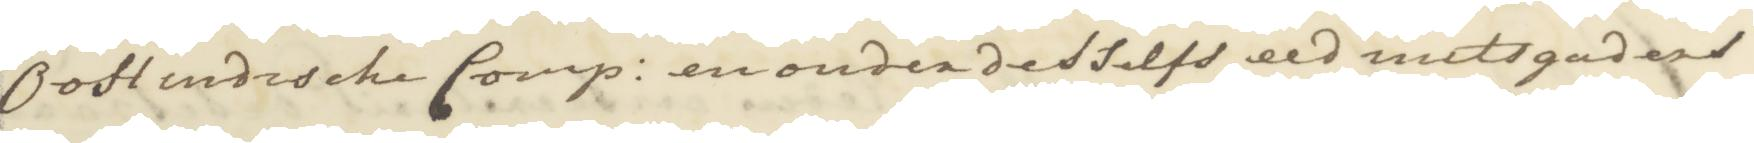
Oost indische Comp: en onder desselfs eed mitsgaders
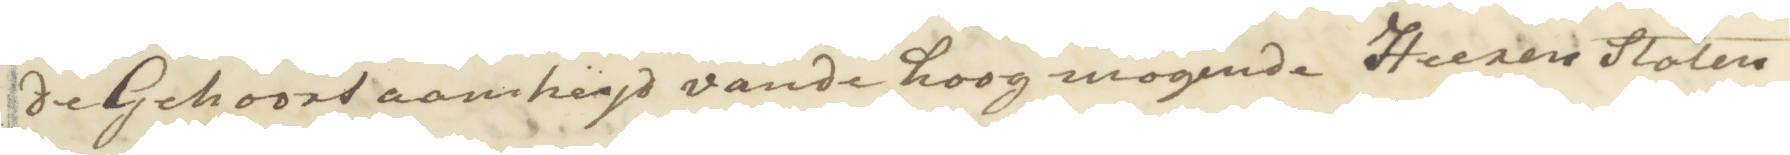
de Gehoorsaamheijd vande hoog mogende Heeren staten
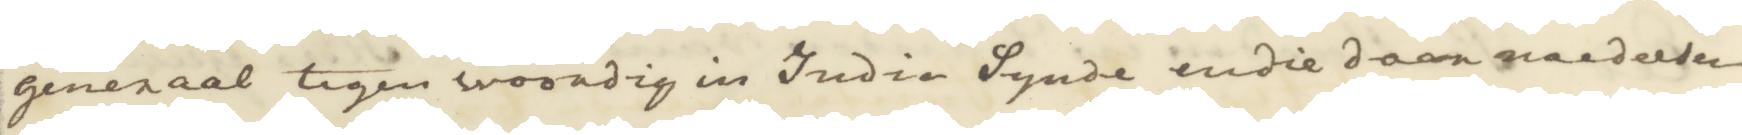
generaal tegenwoordig in India sijnde en die daar nae deesen
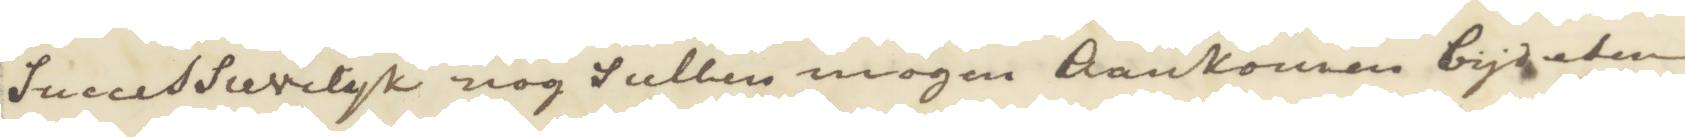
successievelijk nog sullen mogen aankomen bij desen
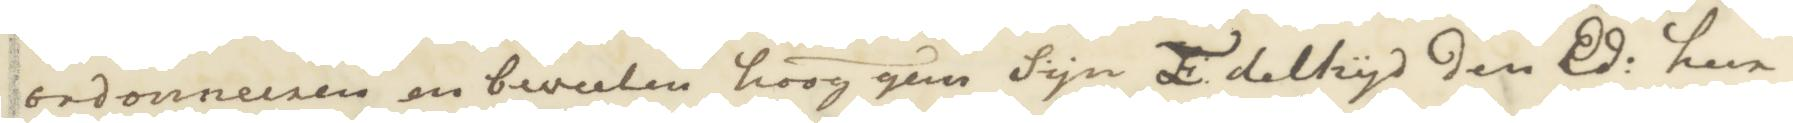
ordonneeren en beveelen hoog gem sijn E: delhijd den Ed: heer
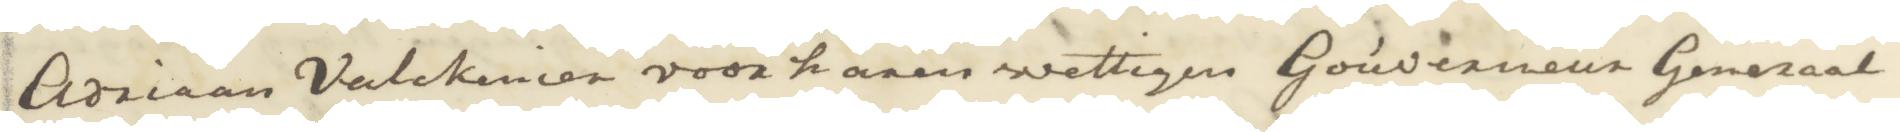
Adriaan Valckenier voor haren wettigen Gouverneur Generaal
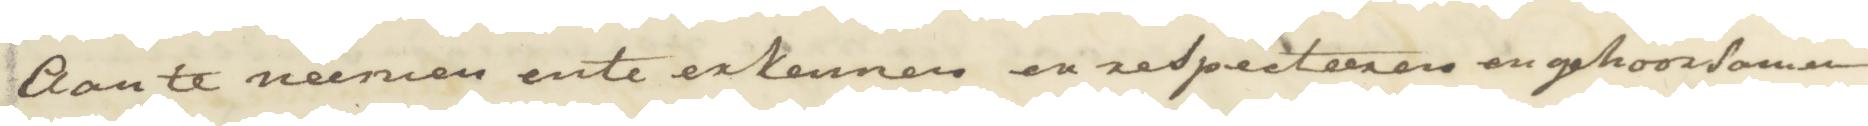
aan te neemen ente erkennen en respecteeren en gehoorsamen
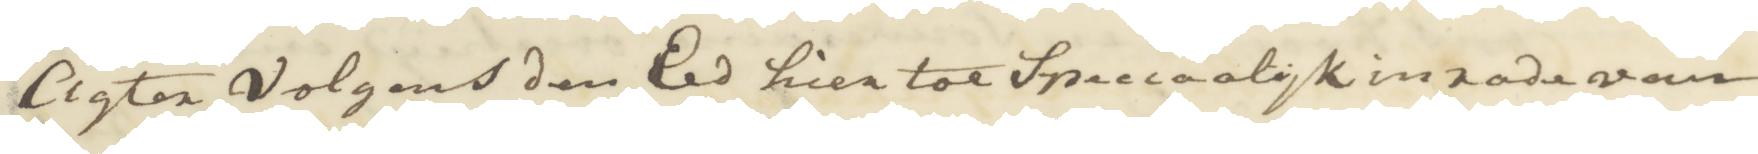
agter volgens den Eed hier toe speciaalijk in rade van
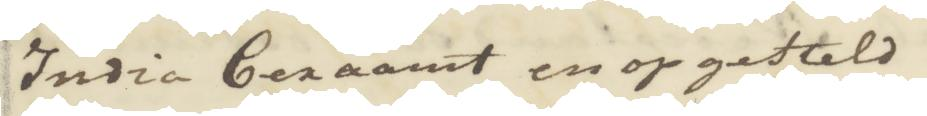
India beraamt en opgesteld
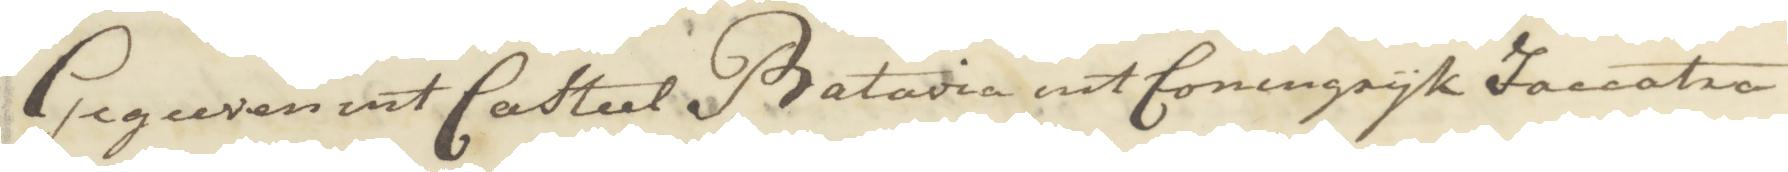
Gegeeven int Casteel Batavia int Coningrijk Jaccatra
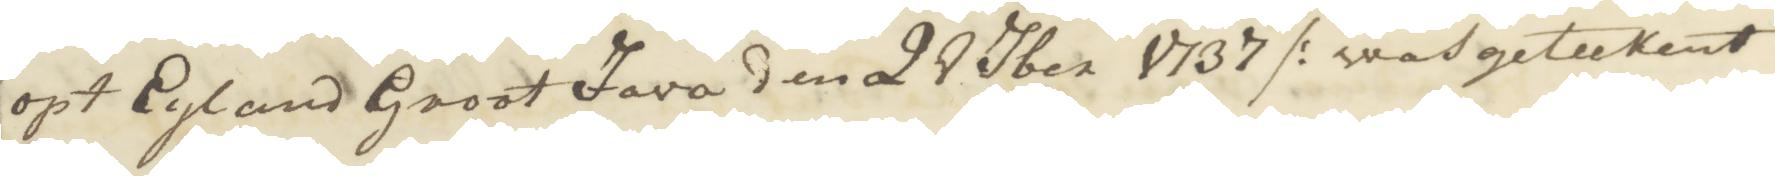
op’t Eyland Groot Iava den 28 Iber 1737 /:was geteekent
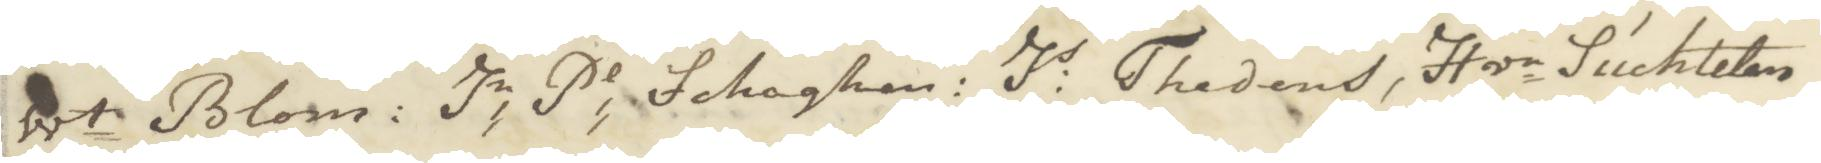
w=t Blom: I„n P„l schaghen: I:s Thedens, H v=n suchtelen
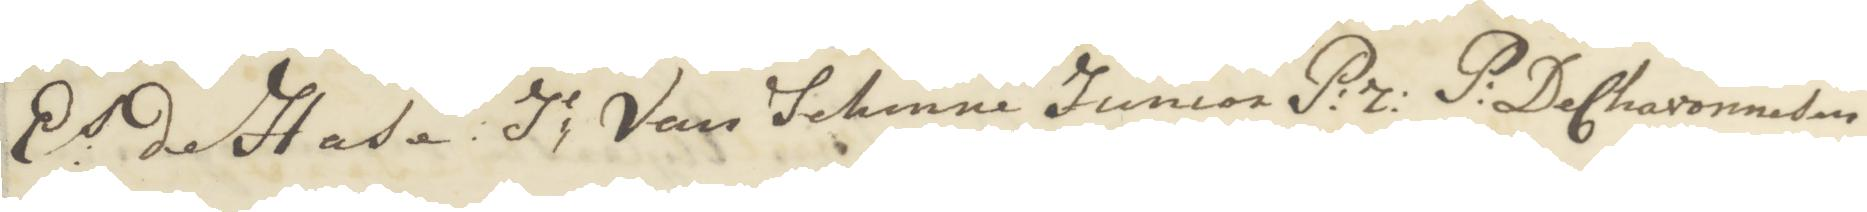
E:s de Hase: I„c van schinne Iunior P: r: P: De Chavonnes en
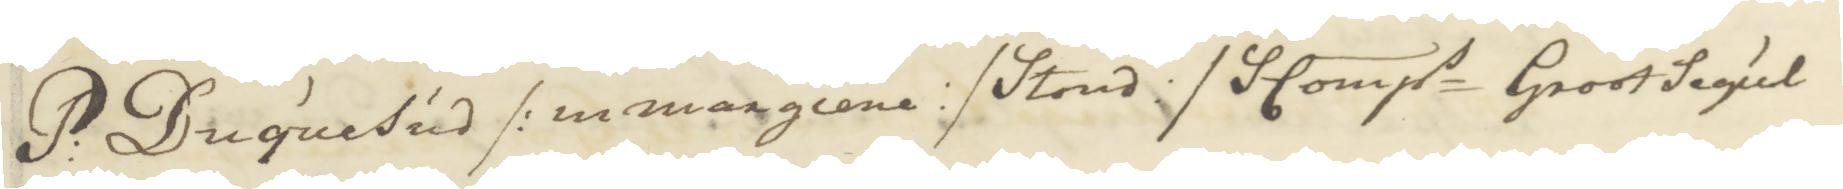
P: Duquesne /:in margiene:/ stond:/ sComp=s Groot segul
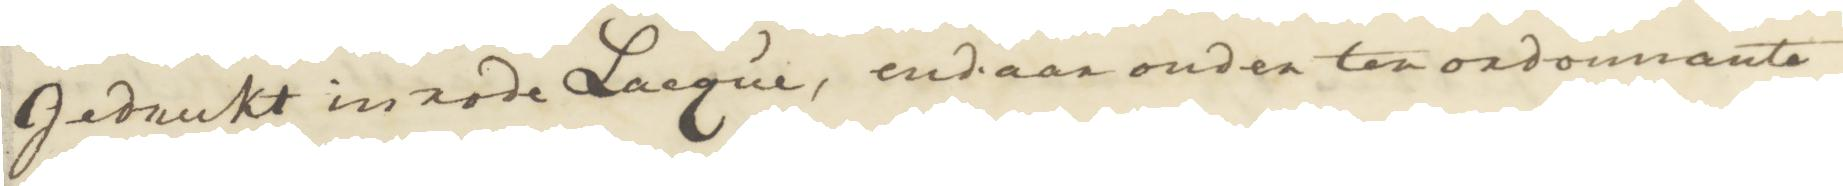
gedrukt in rode Lacque, en daar onder ter ordonnante
